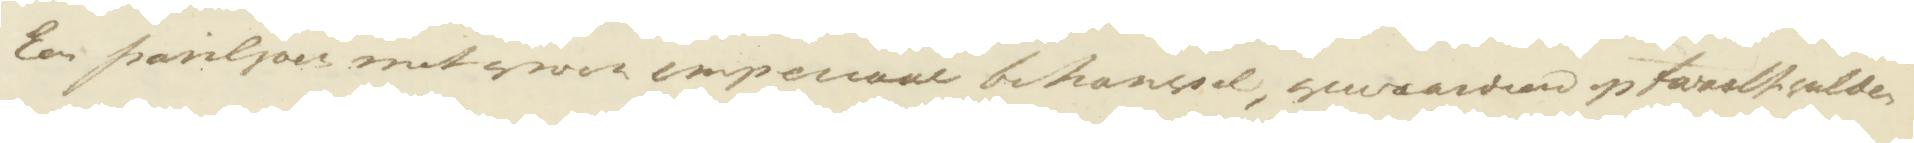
Een paviljoen met groot imperiaal behangsel, gewaardeerd op twaalf gulden
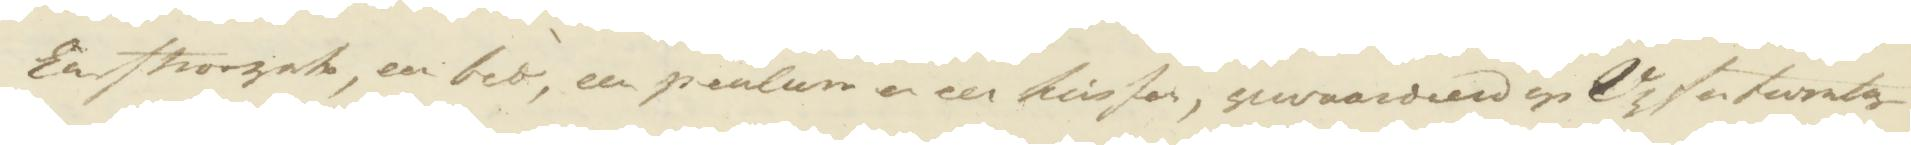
En stroozak, een bed, een peuluw en een kussen, gewaardeerd op Vyf en twintig
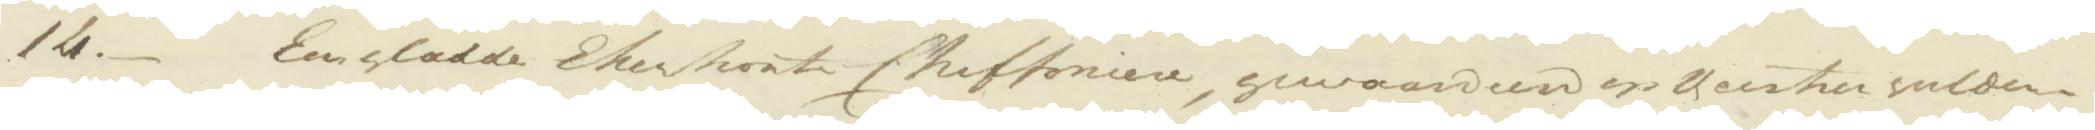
14.— Een gladde Ekenhoute Chiffoniere, gewaardeerd op Veertien gulden
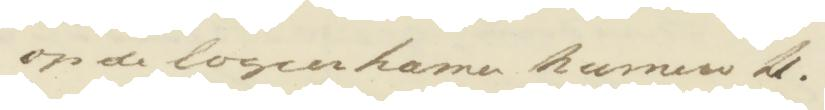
op de logeerkamer numero 4.
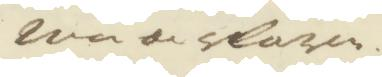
over de glazen.
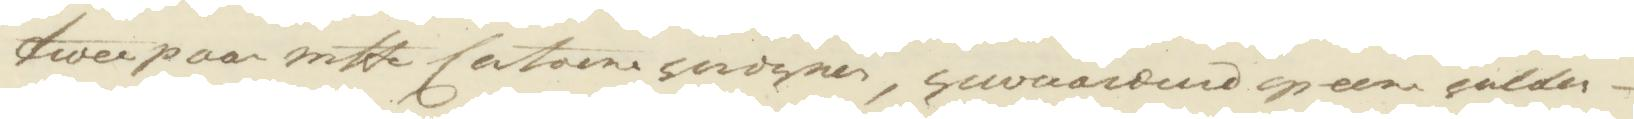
twee paar nette Catoene gordynen, gewaardeerd op een gulden
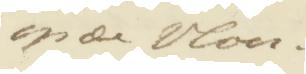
op de Vloer
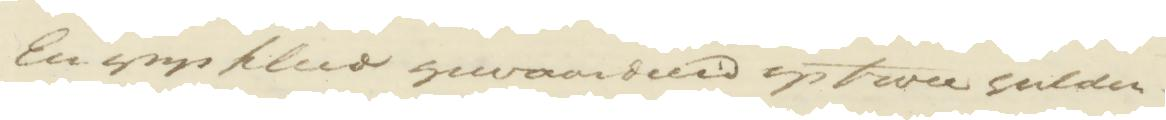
En grys kleed gewaardeerd op twee gulden.
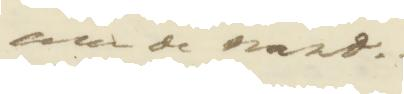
aan de wand
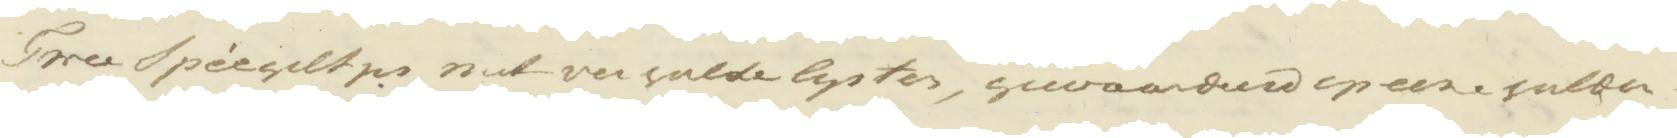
Twee spiegeltjes met vergulde lysten, gewaardeerd op eene gulden
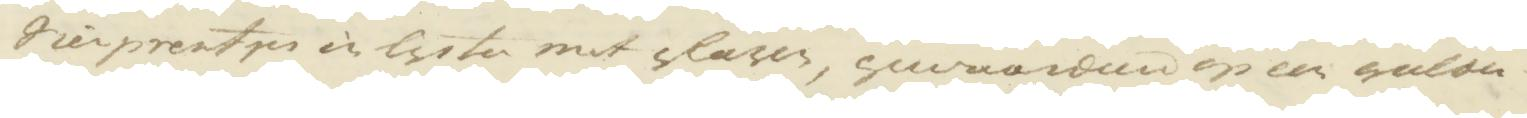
Vier prentjes in lysten met glazen, gewaardeerd op een gulden
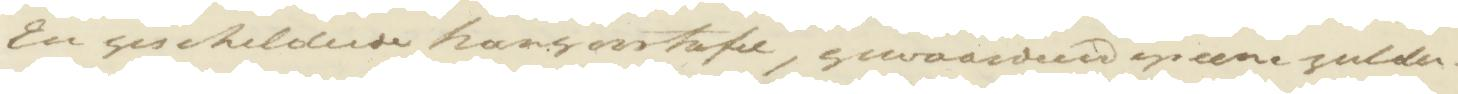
En geschilderde hangoortafel, gewaardeerd op eene gulden.
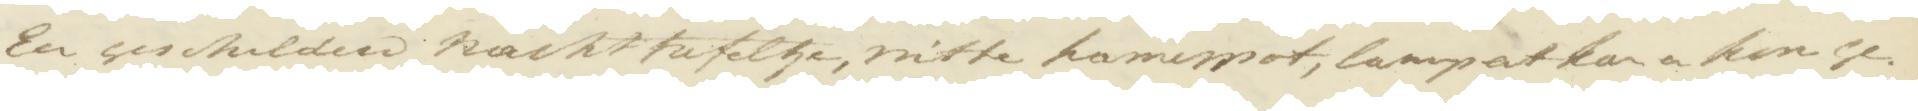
Een geschilderd nachttafeltje, witte kamerpot, lampetkan en kom ge.
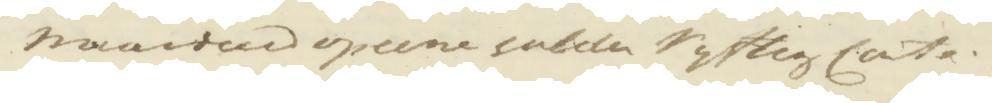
waardeerd op eene gulden Vyftig Cents.
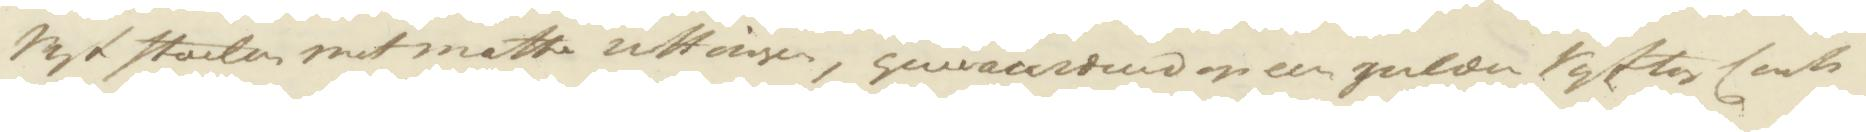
Vyf stoelen met matte zittingen, gewaardeerd op een gulden vyftig Cents
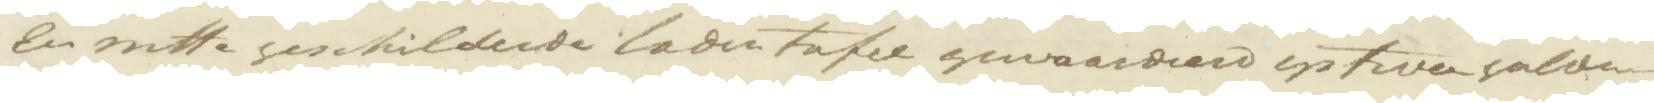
Een witte geschilderde ladentafel gewaardeerd op twee gulden
